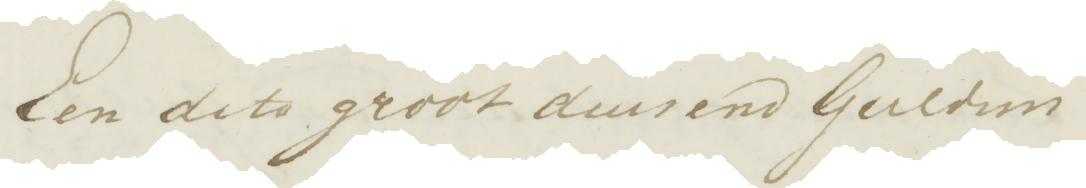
Een dito groot duisend Guldens
